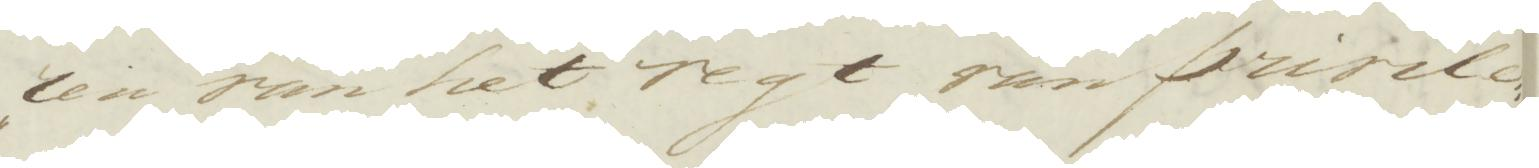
„ren van het regt van Privile„
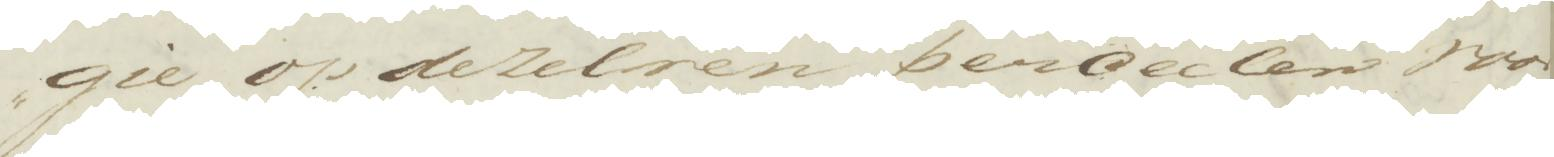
„gie op dezelven perceelen voor
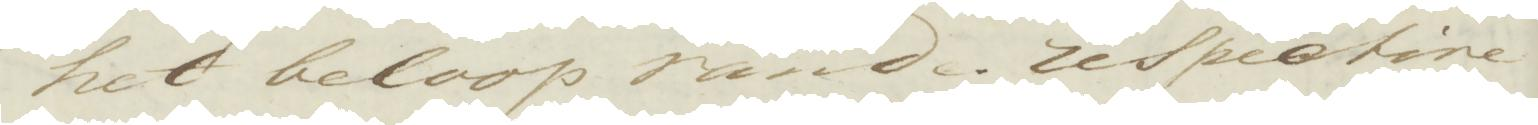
het beloop van de respective
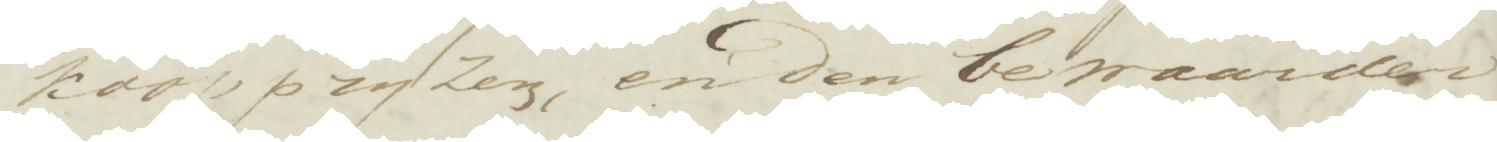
kooppryzen, en den bewaarder
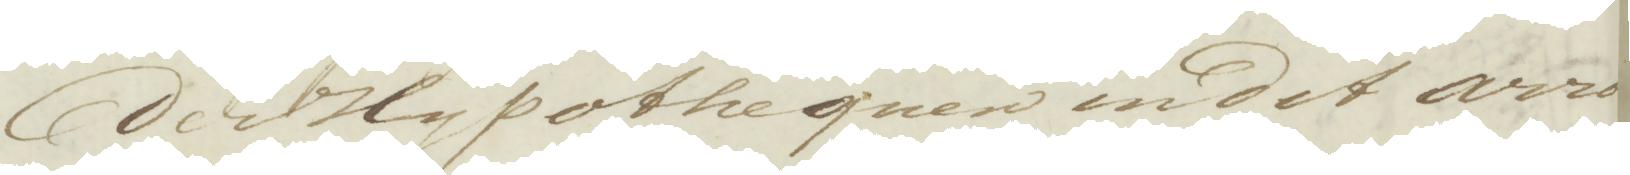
der Hypothequen in dit arro
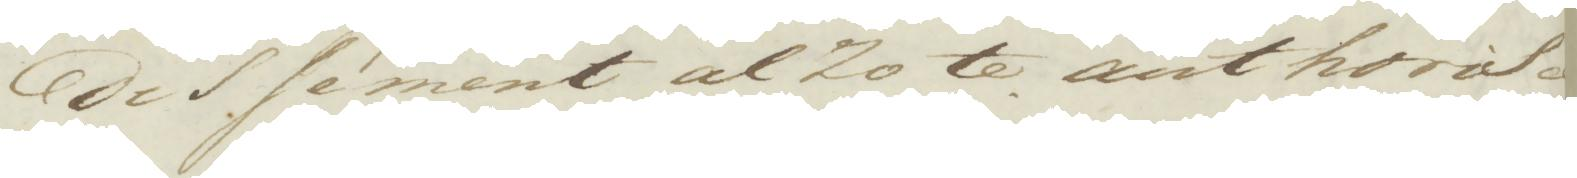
dissement al zo te authorise
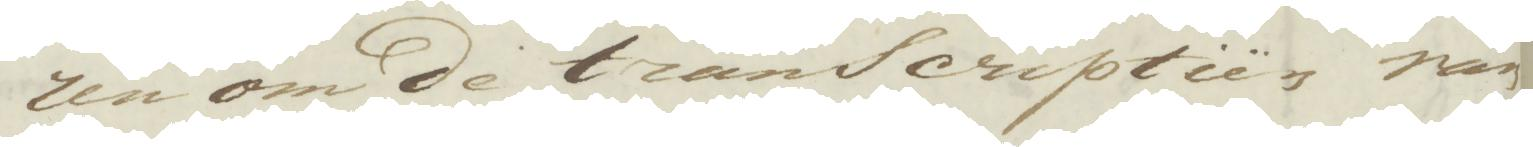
ren om de transcriptiën van
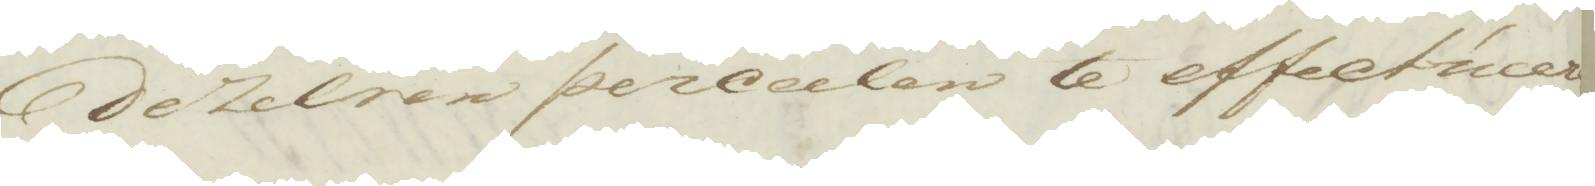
dezelven perceelen te effectueer
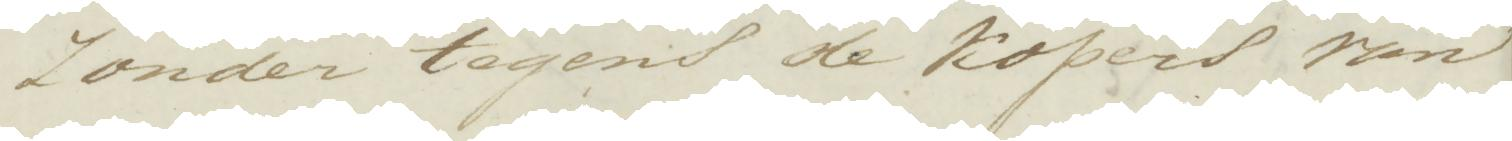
zonder tegens de kopers van
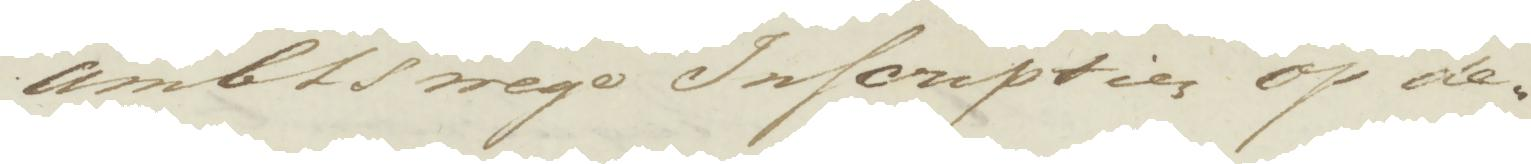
ambtswege Inscriptien op de„
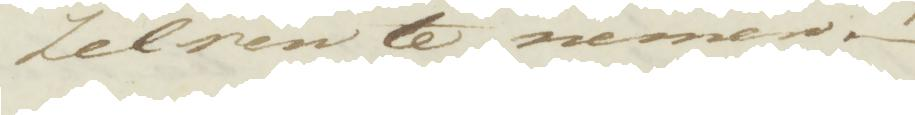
zelven te nemen.
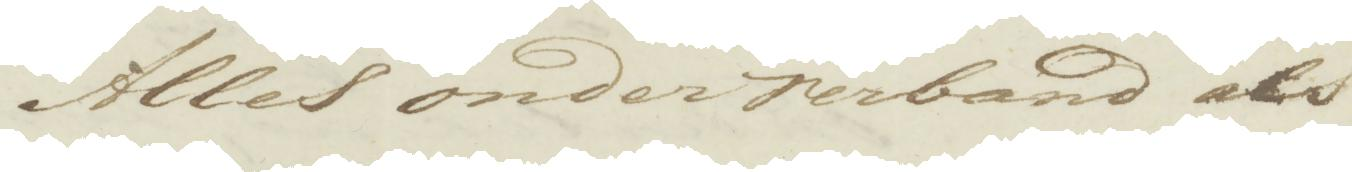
Alles onder verband als
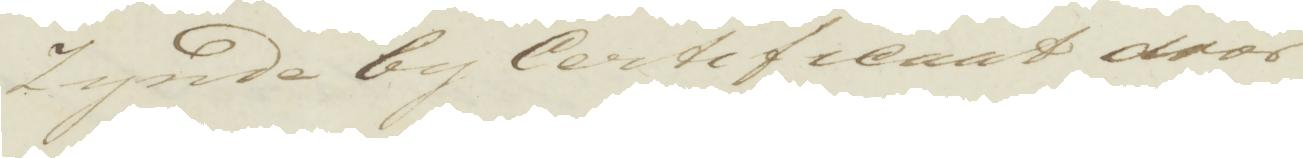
Zynde by Certificaat door
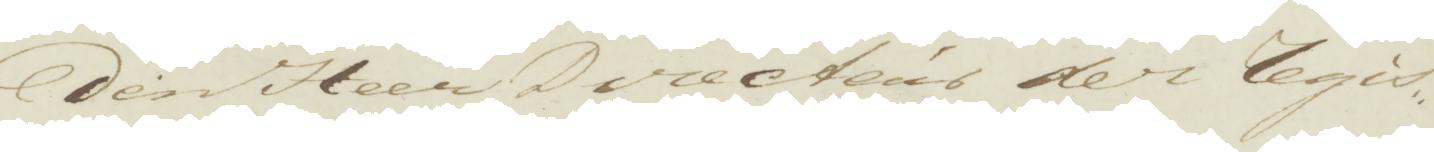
den Heer Directeur der regis„
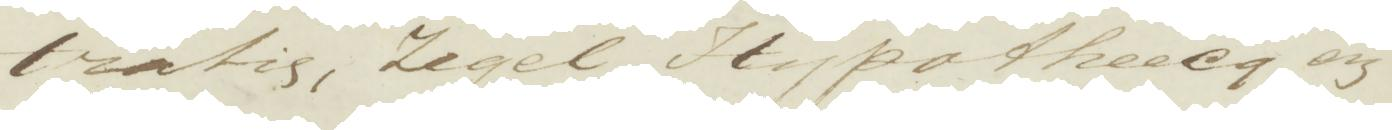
tratie, zegel, Hypotheecq en
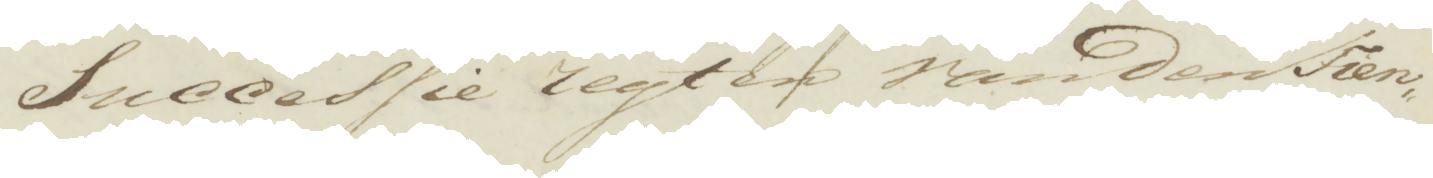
successie regten van den Tien„
